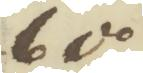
6 do
